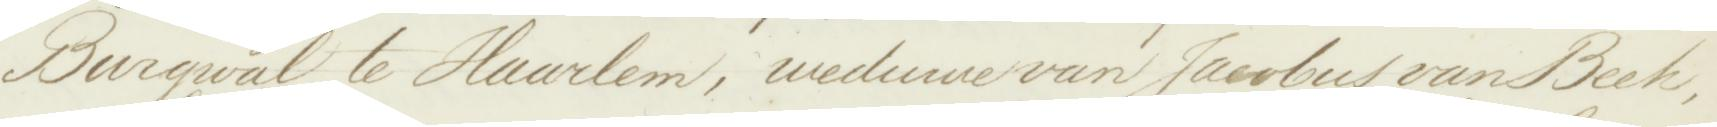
Burgwal te Haarlem, weduwe van Jacobus van Beek,
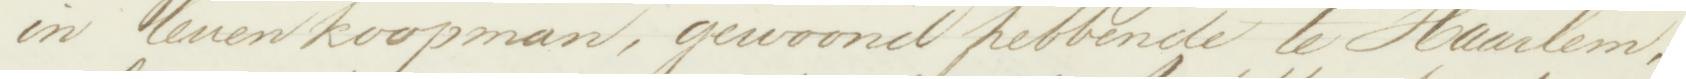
in leven koopman, gewoond hebbende te Haarlem,
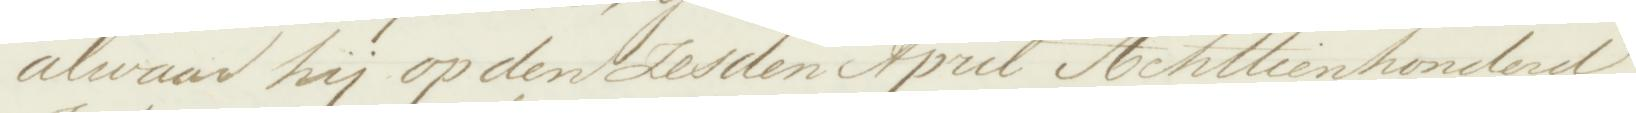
alwaar hij op den Zesden April Achttienhonderd
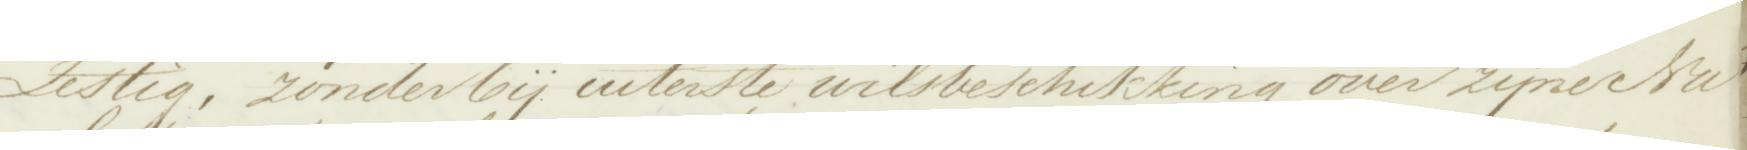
Zestig, zonder bij uiterste wilsbeschikking over zijne Na
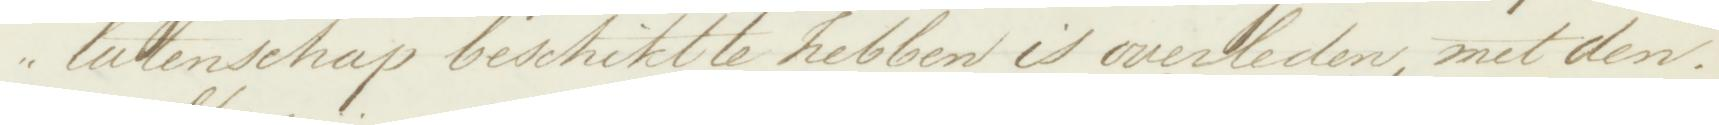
„latenschap, beschikt te hebben is overleden, met den
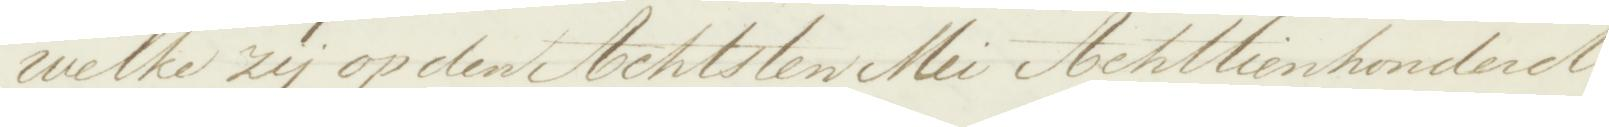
welke zij op den Achtsten Mei Achttienhonderd
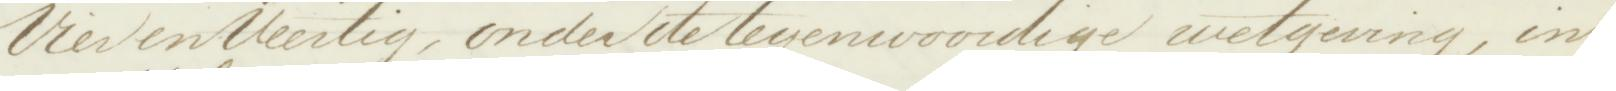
Vier en Veertig, onder de tegenwoordige wetgeving in
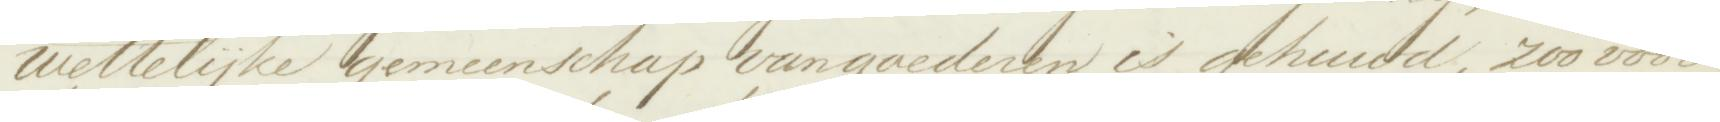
wettelijke gemeenschap van goederen is gehuwd, zoo voor
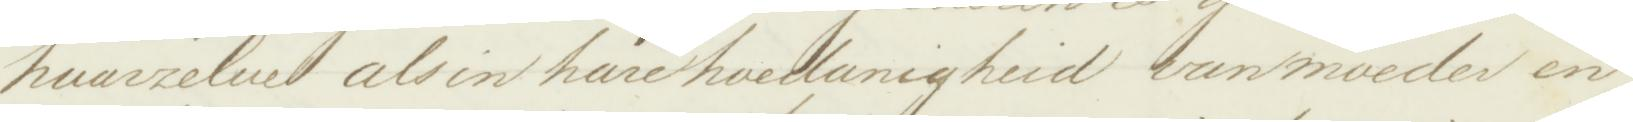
haarzelve als in hare hoedanigheid van moeder en
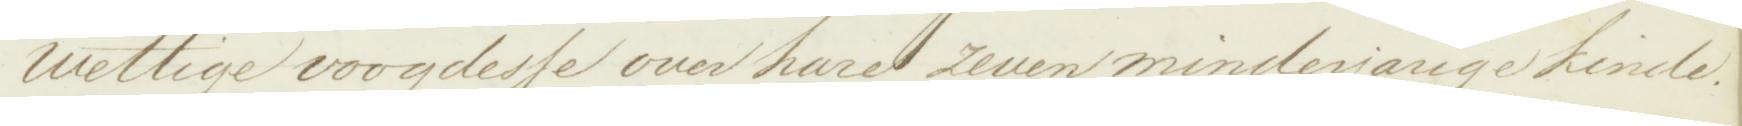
wettige voogdesse over hare zeven minderjarige kinde„
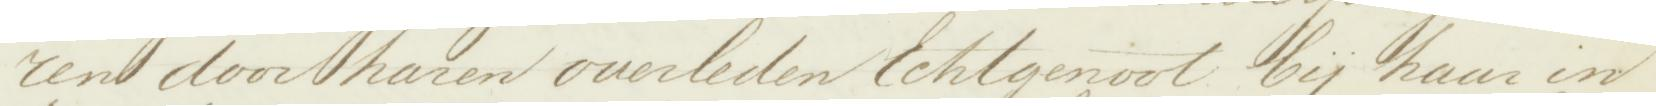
ren door haren overleden Echtgenoot, bij haar in
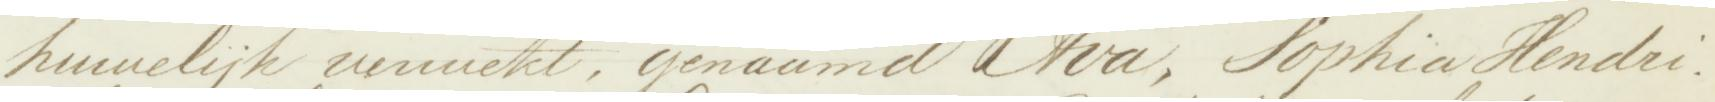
huwelijk verwekt, genaamd Ava, Sophia Hendri„
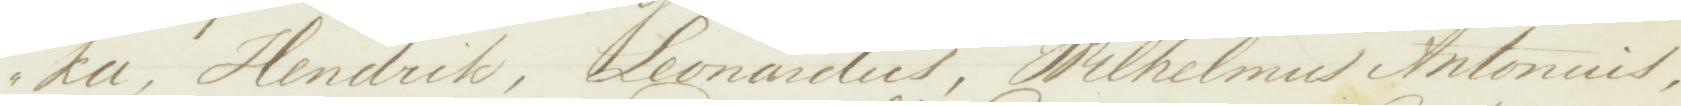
„ka, Hendrik, Leonardus, Wilhelmus Antonius,
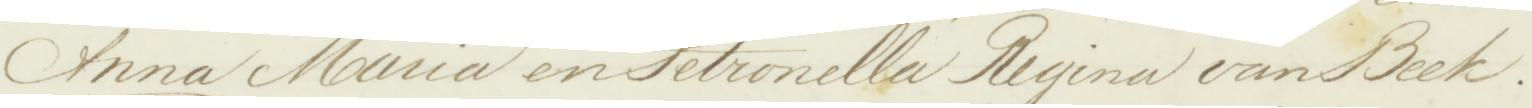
Anna Maria en Petronella Regina van Beek.
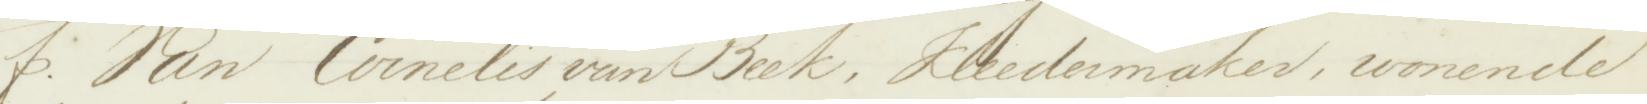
f. Van Cornelis van Beek, Kleedermaker, wonende
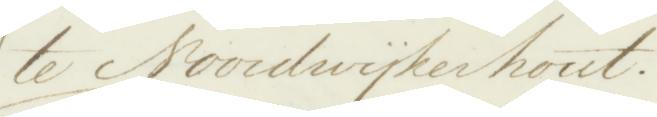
te Noordwijkerhout.
